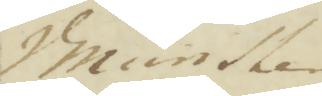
V munster
